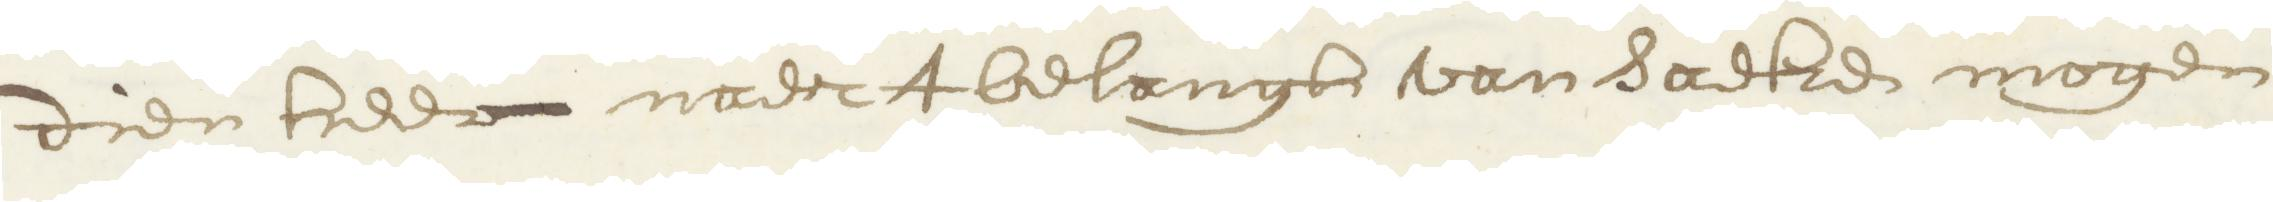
dien heer naer t belangh van saeken mogen
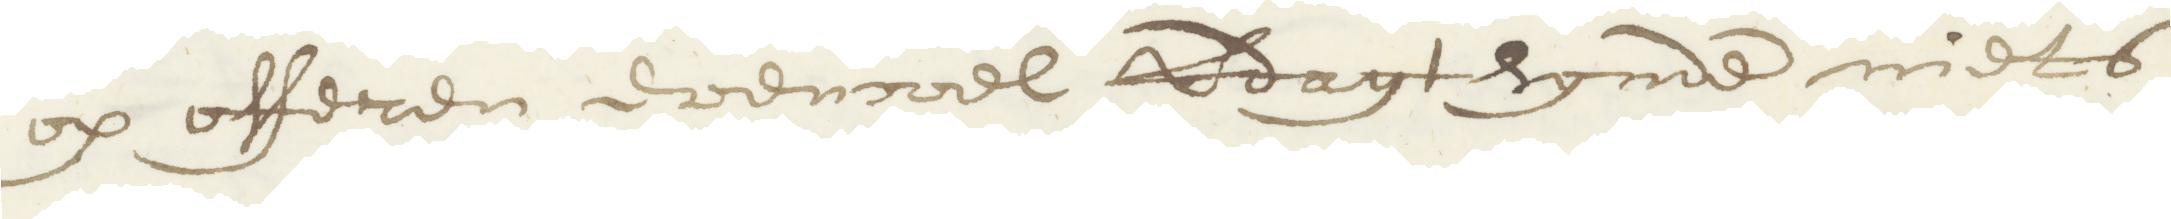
op offeren evenwel verdagt synde niets
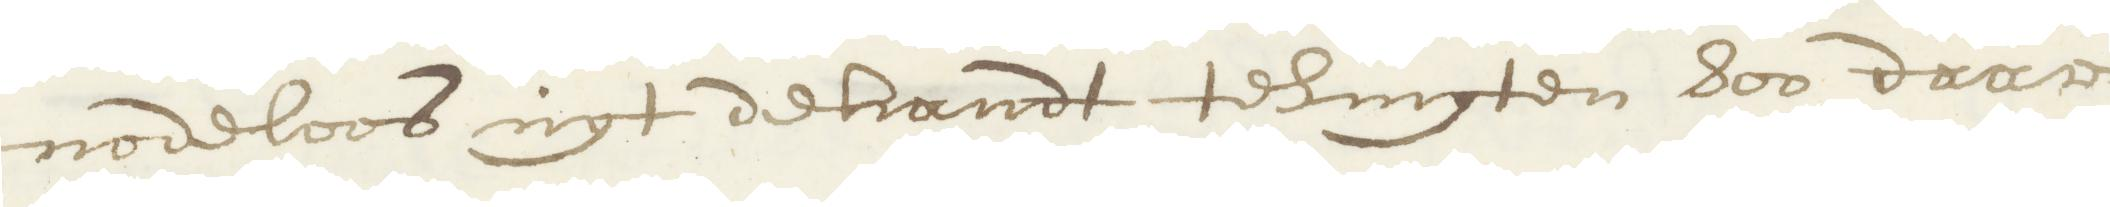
nodeloos uyt dehandt tesmyten soo daar
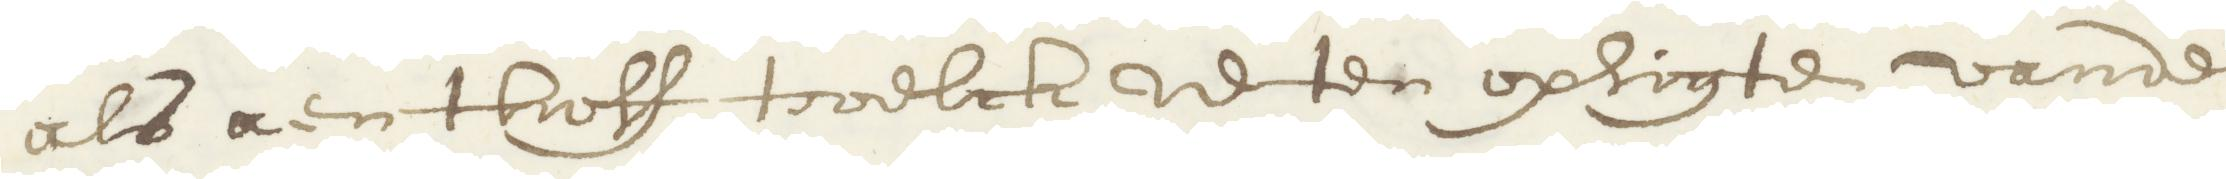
als aen thoff twelck te ten opsigte vande
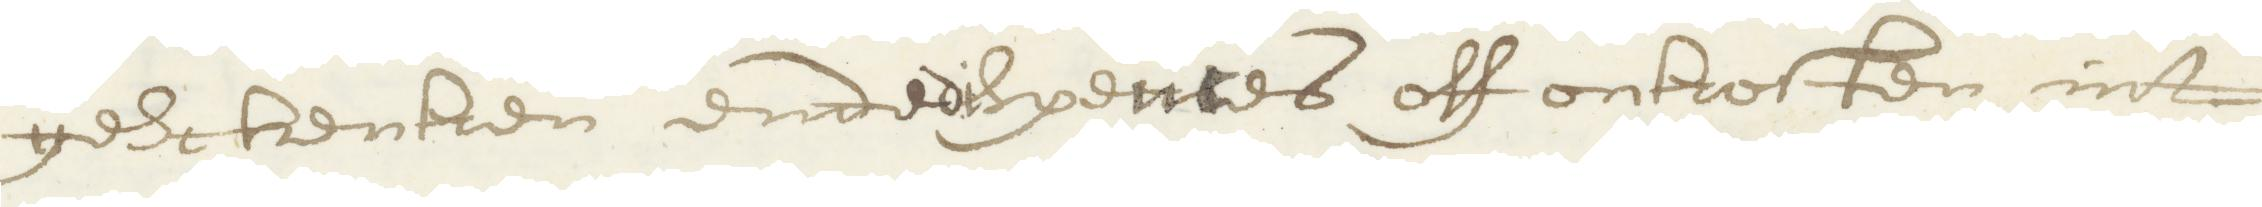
geschenken endedispences off onkosten int
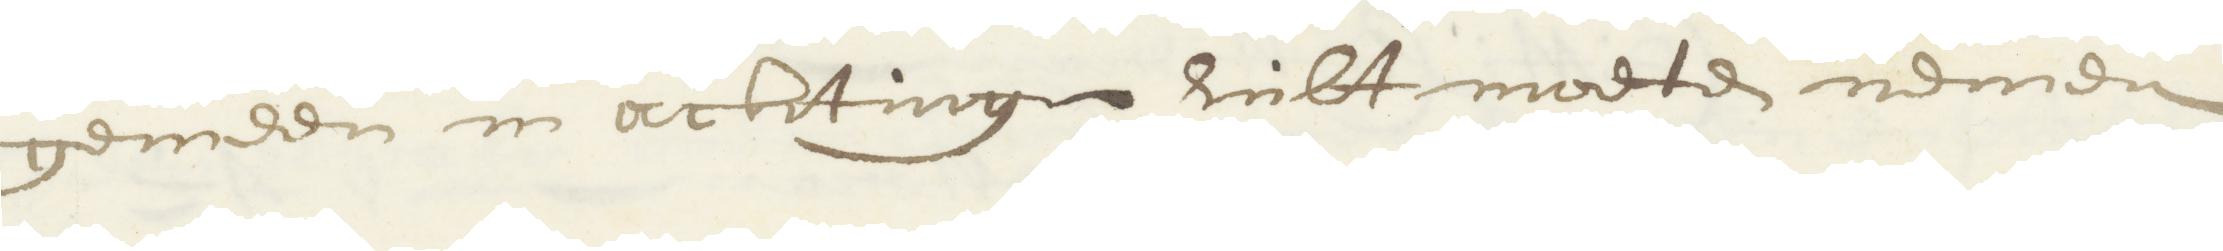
gemeen in achtinge sult moeten nemen
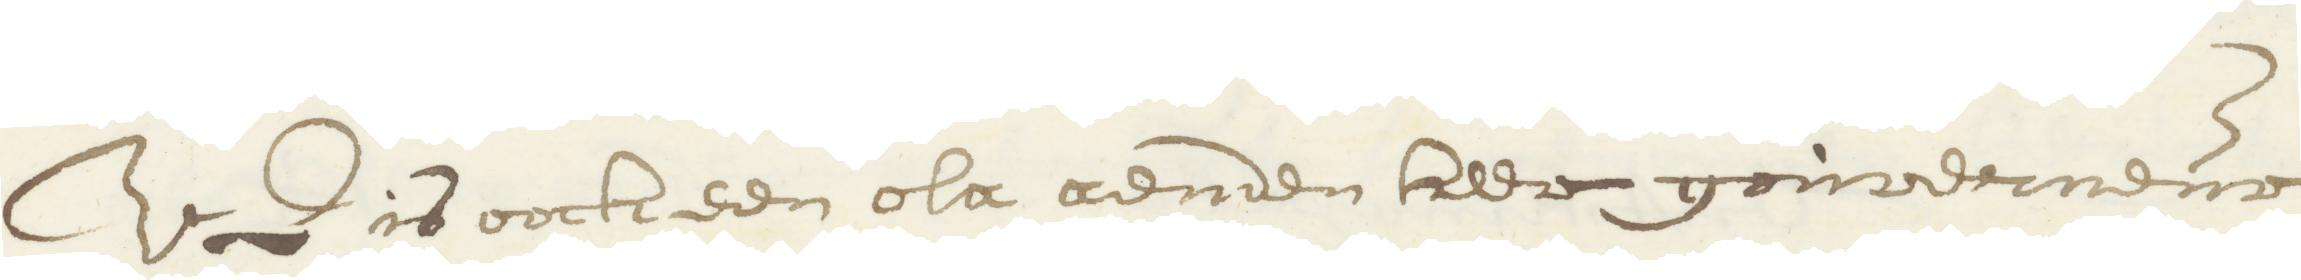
VE is oock een ole aen den heer gouverneur
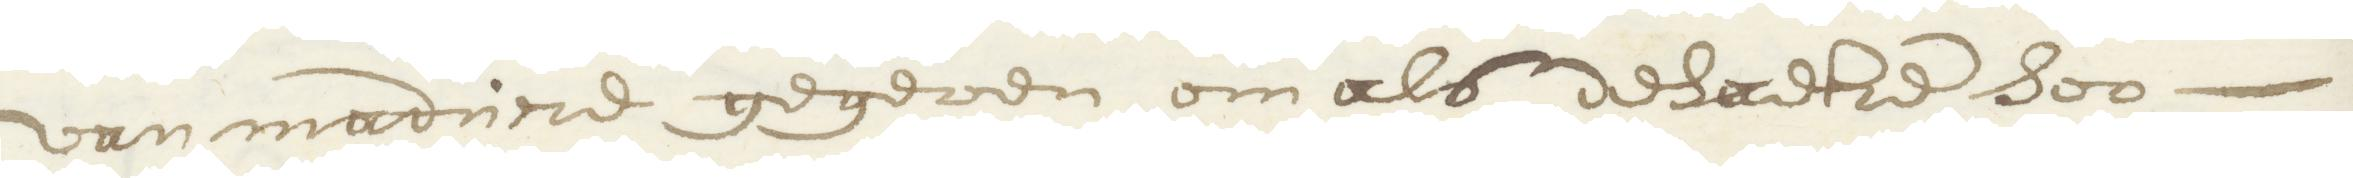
van madure gegeven om als desaeke soo —
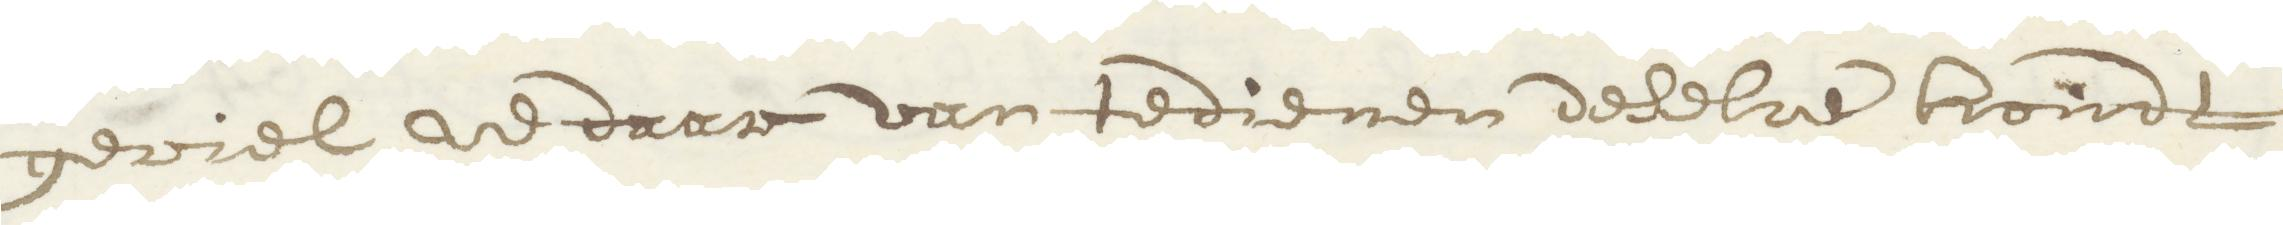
gevielzte daar van tedienen deselve houdt
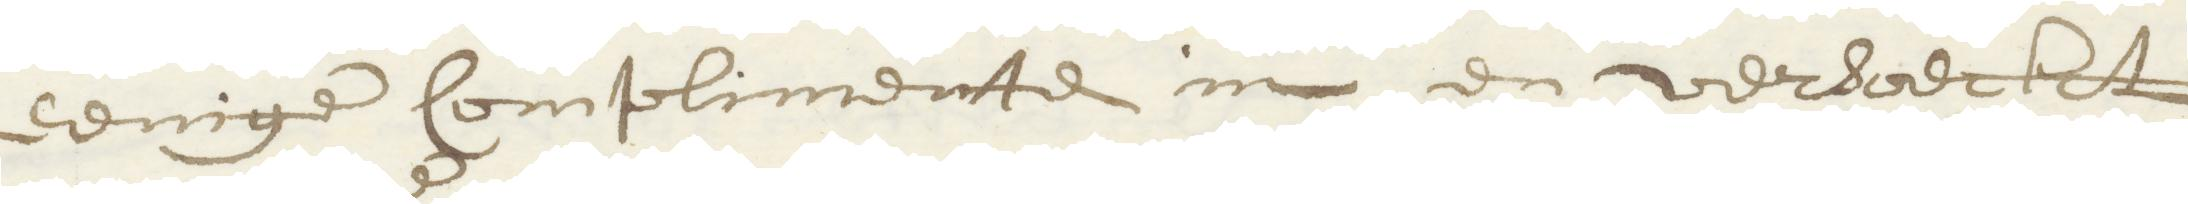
eenige Complimenten in en versoeckt
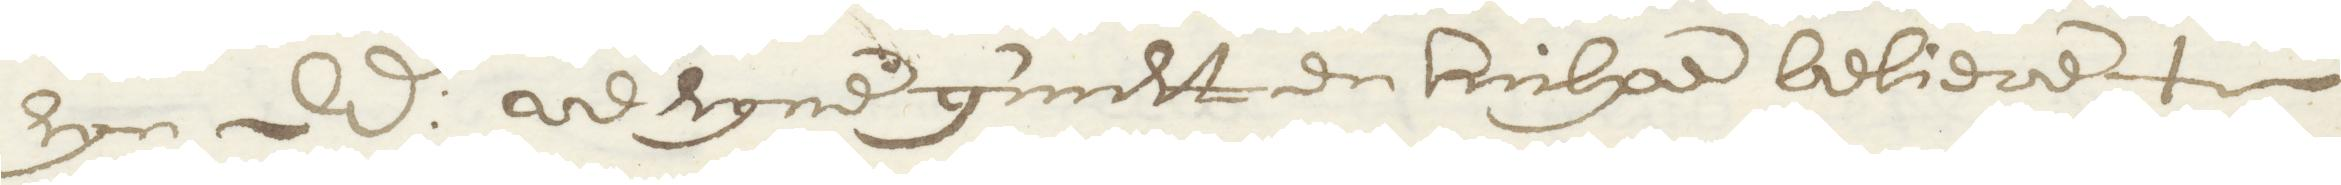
sijn EE: te syne gunst en hulpe believe te
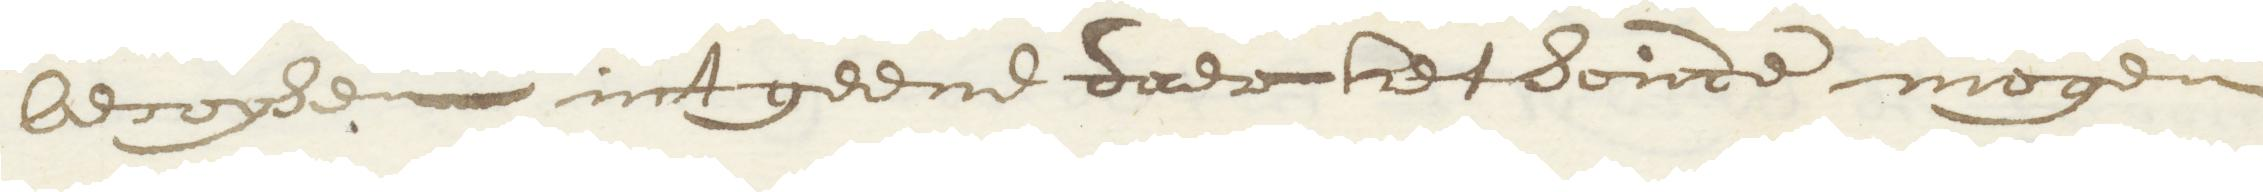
bewysen int geene daer het soude mogen
